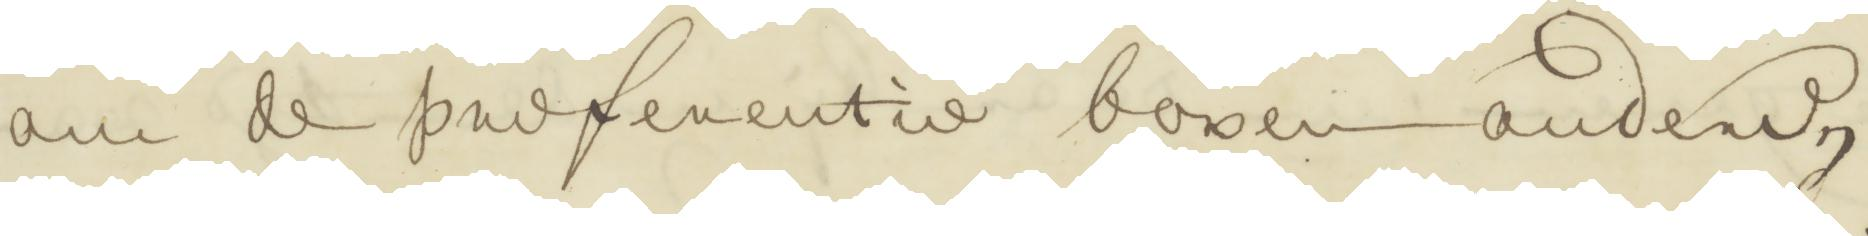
om de preferentie boven anderen
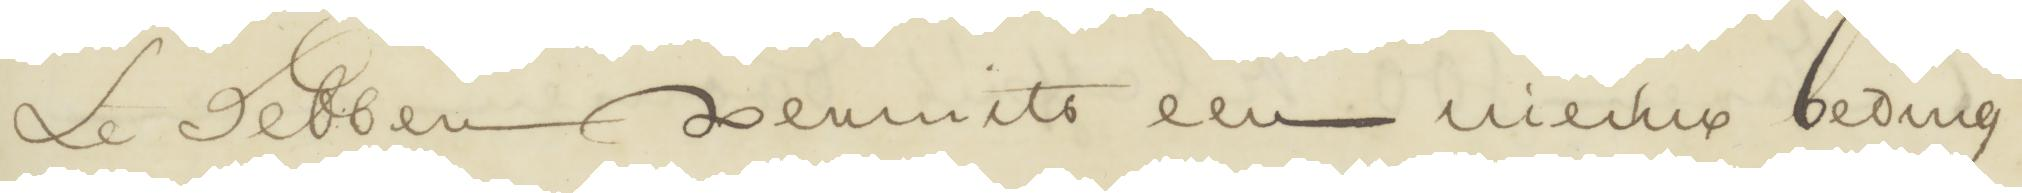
te hebben vermits een nieuw beding
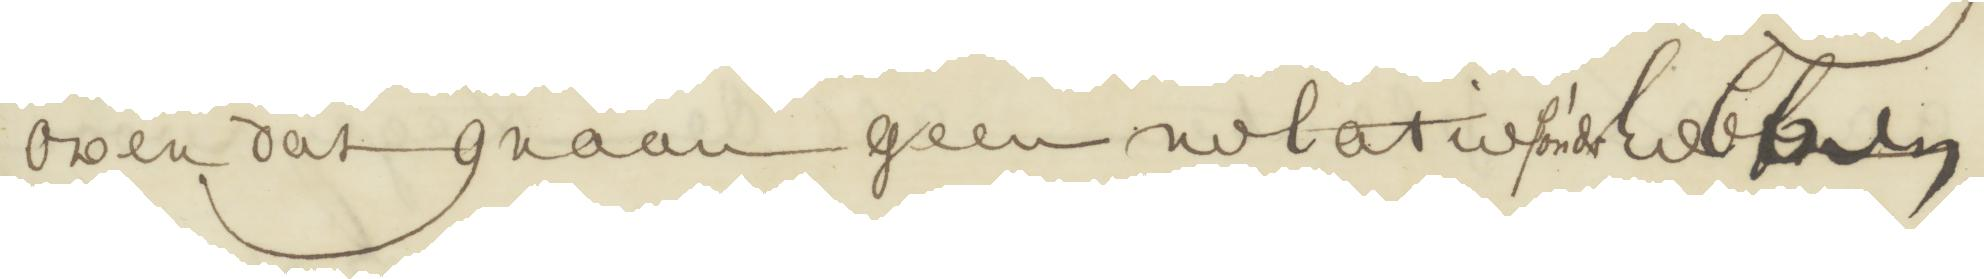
over dat graan geen relatie soude hebben
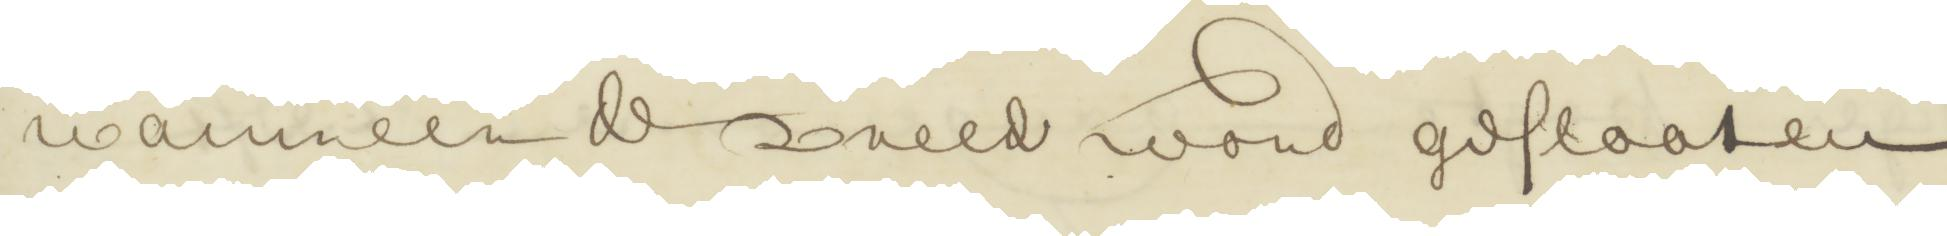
wanneer de vreede word geslooten
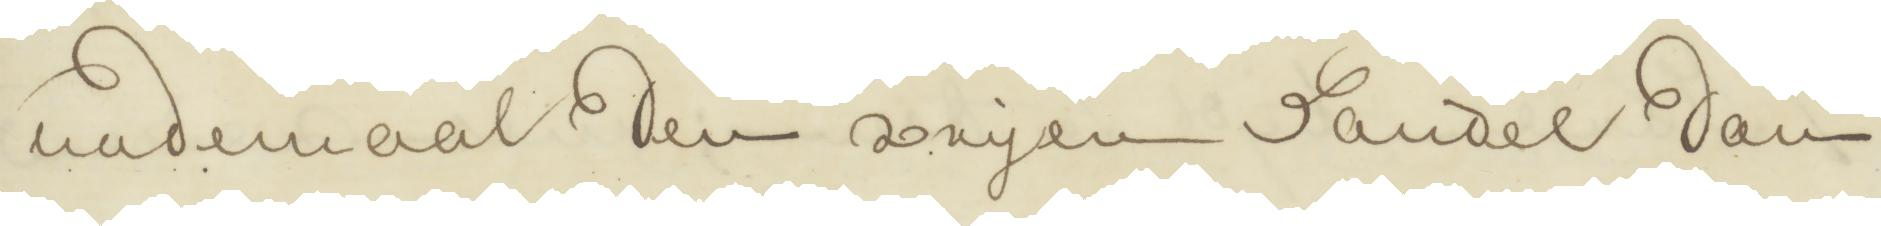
nademaal den vrijen handel dan
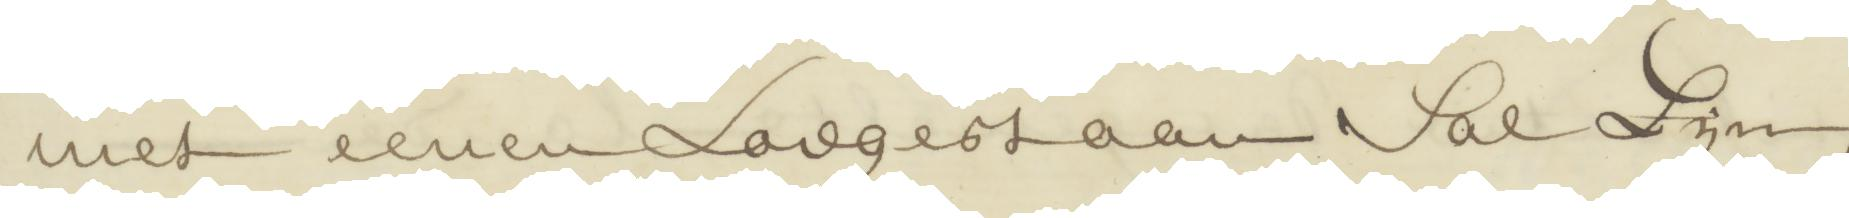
met eenen toegestaan sal zijn,
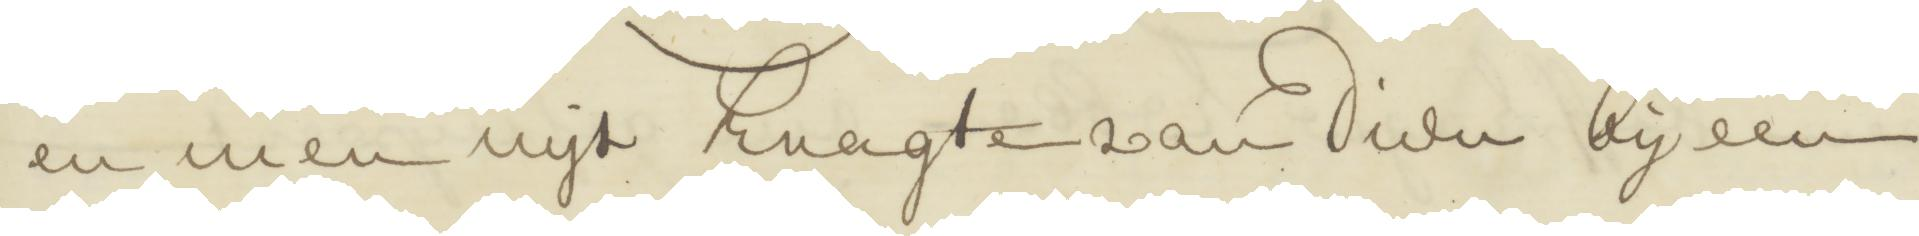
en men uijt kragte van dien bij een
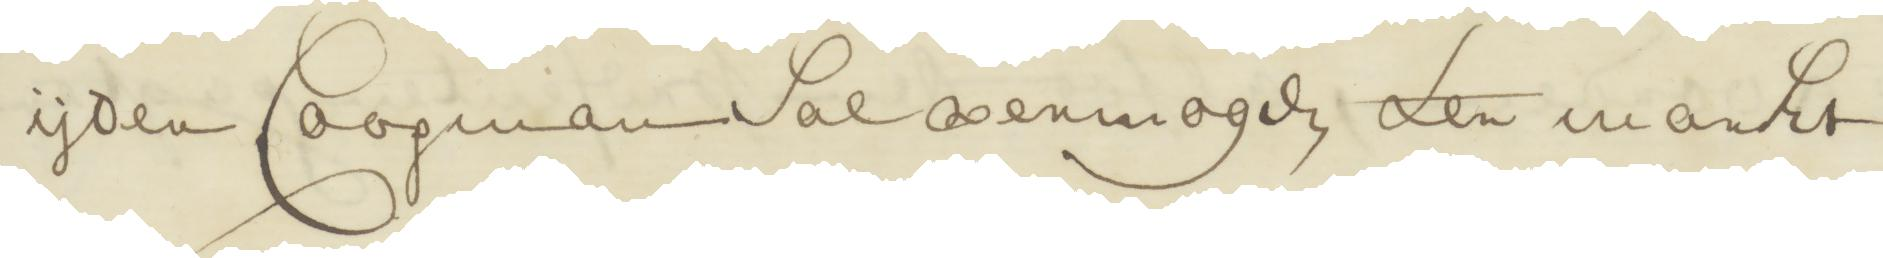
ijder Coopman sal vermogen ter markt
